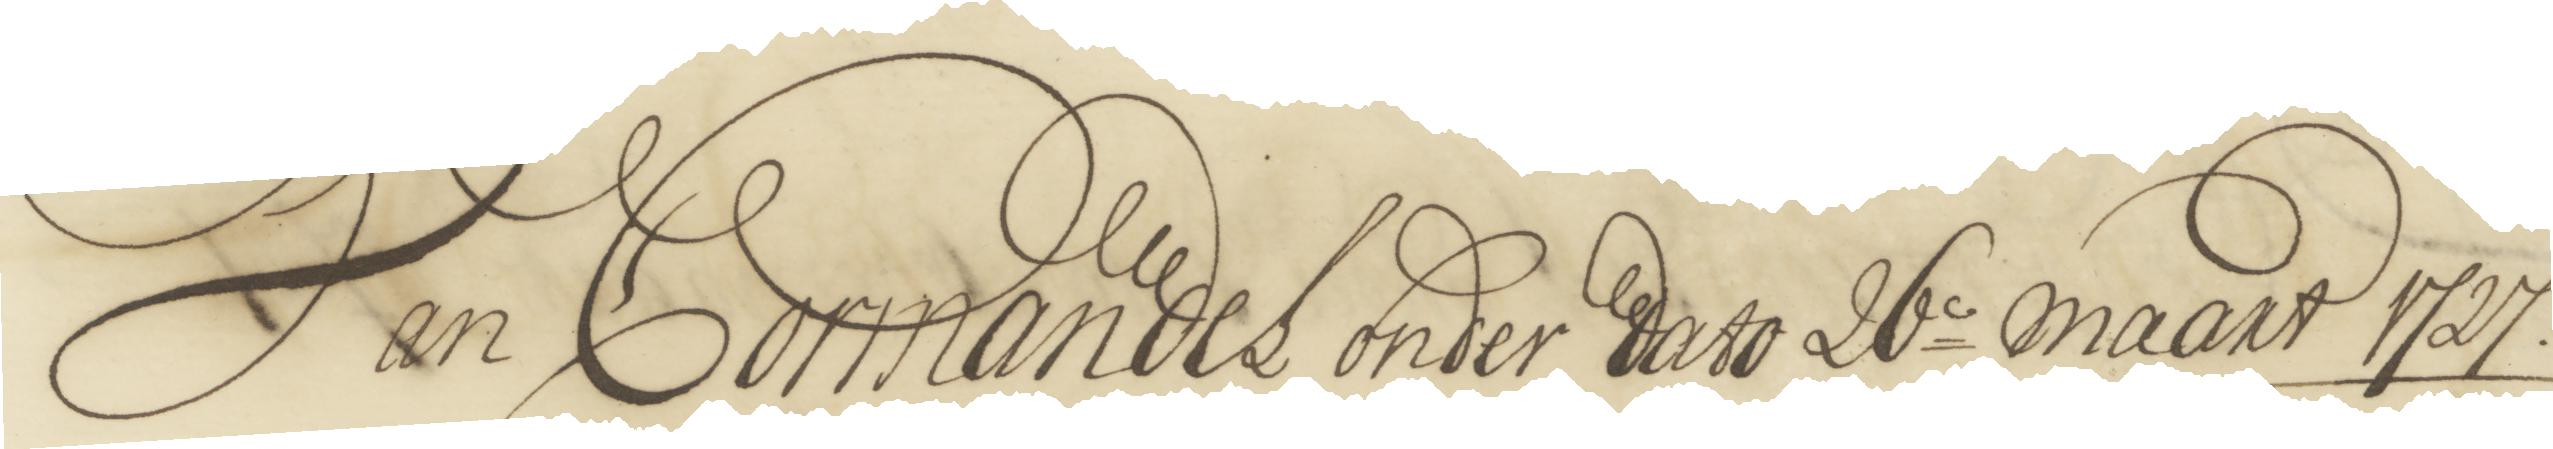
Van Cormandel onder dato 26=e maart 1727.
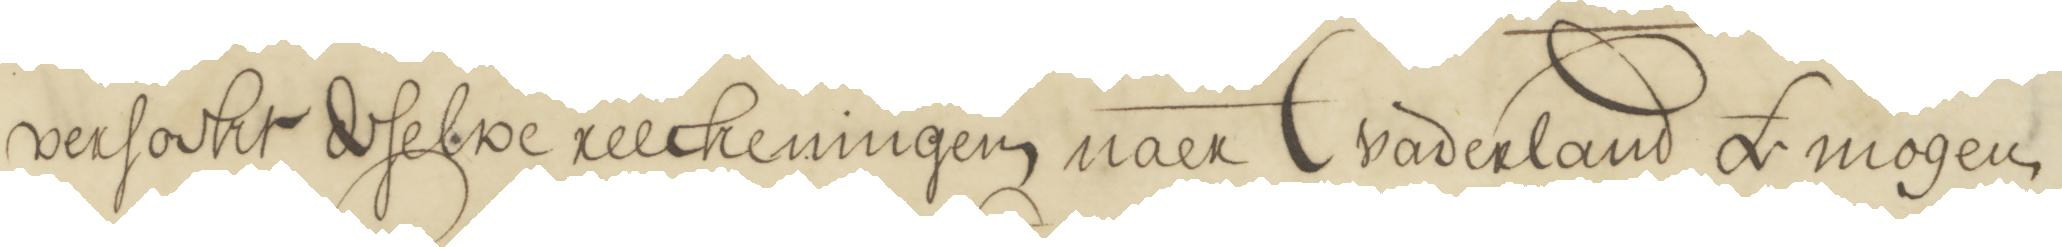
versoekt deselve reeckeningen naer 't vaderland te mogen
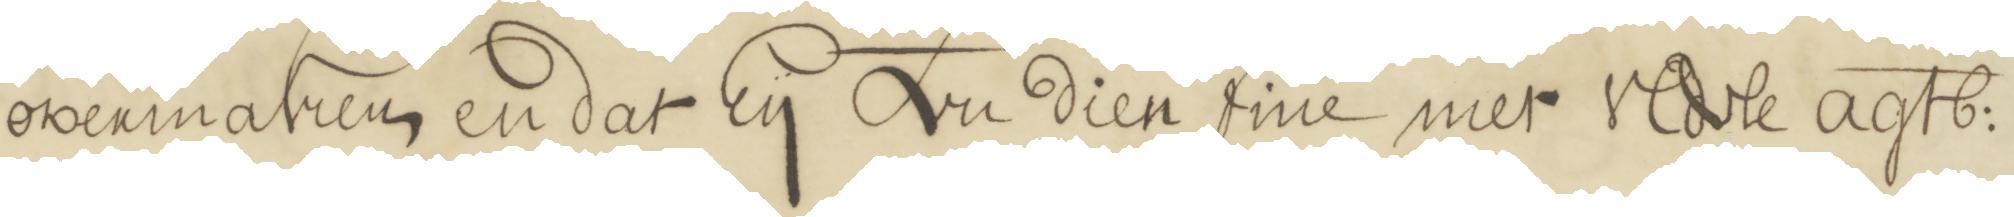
overmaken en dat hij ten dien fine met VEdele agtb:
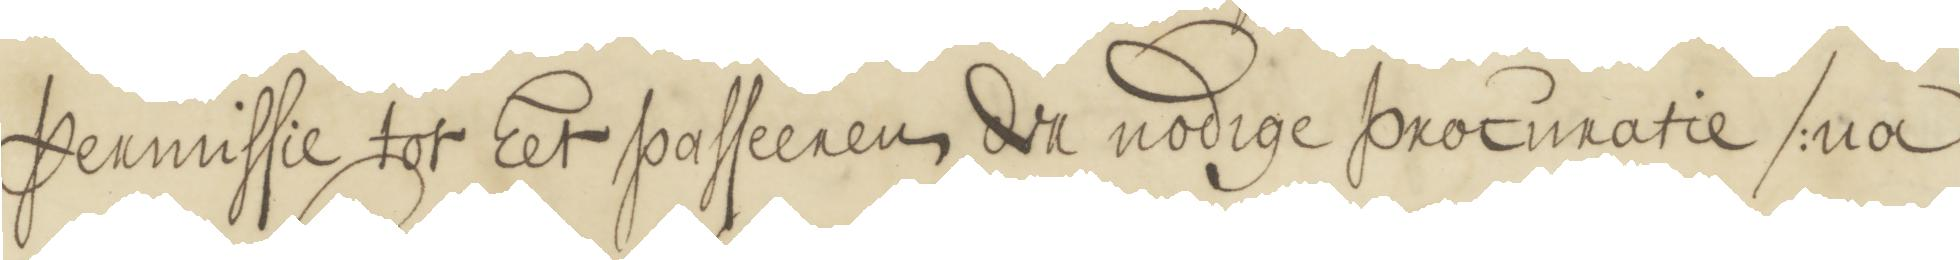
permissie tot het passeeren der nodige procuratie /:na
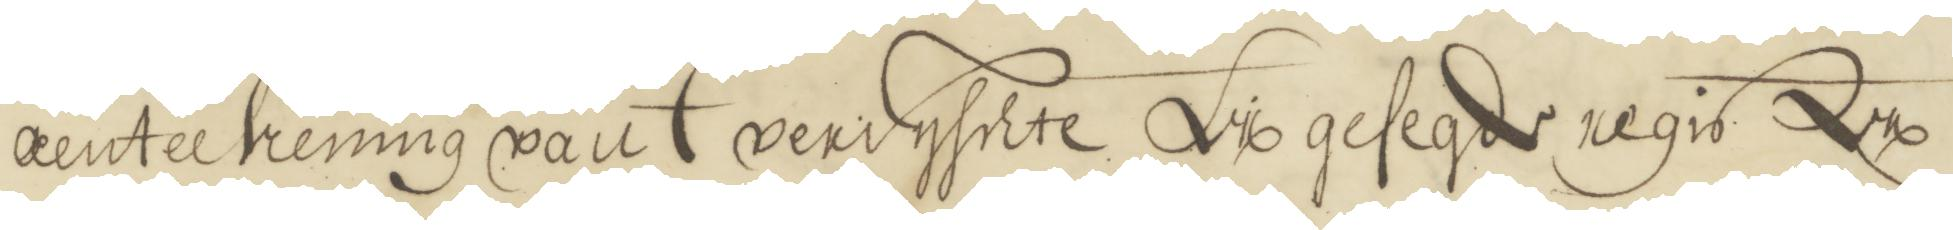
aenteekening van ’t verEyschte ter gesegde register
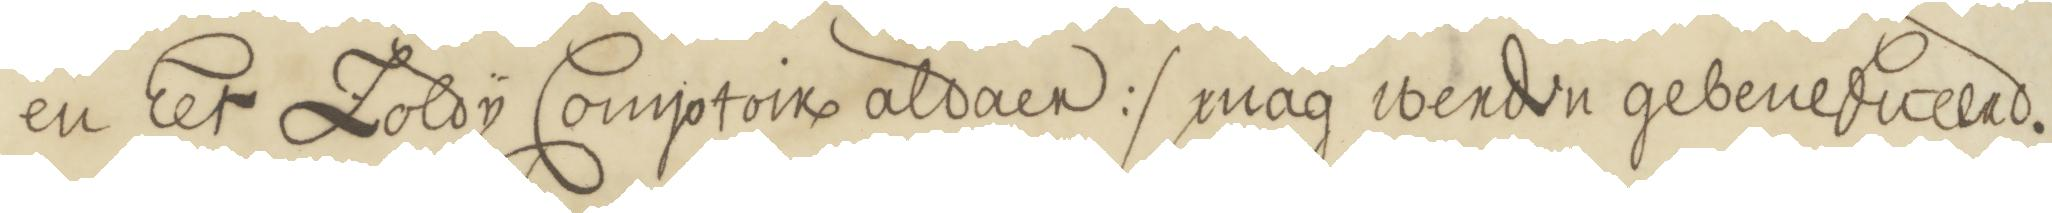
en het Zoldij Comptoir aldaer:/ mag werden gebeneficeerd.
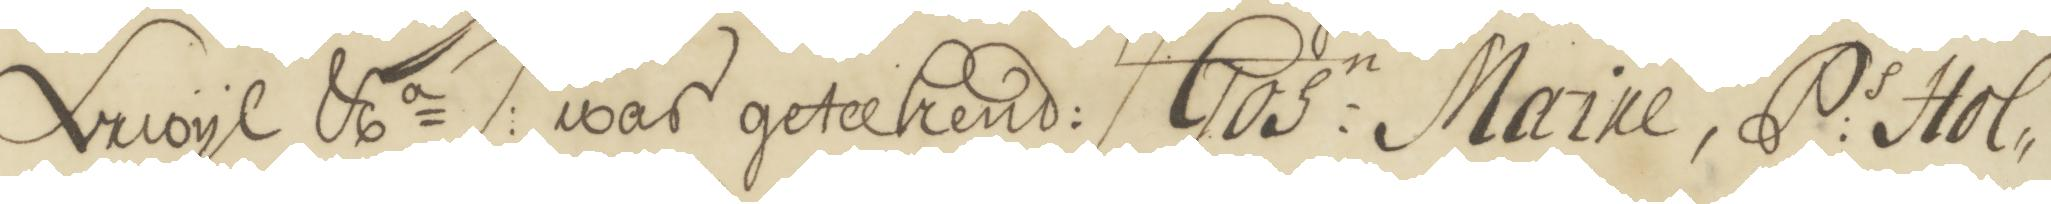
Terwijl &=a /: was geteekend:/ Gos:n Maire, P:s Hol„
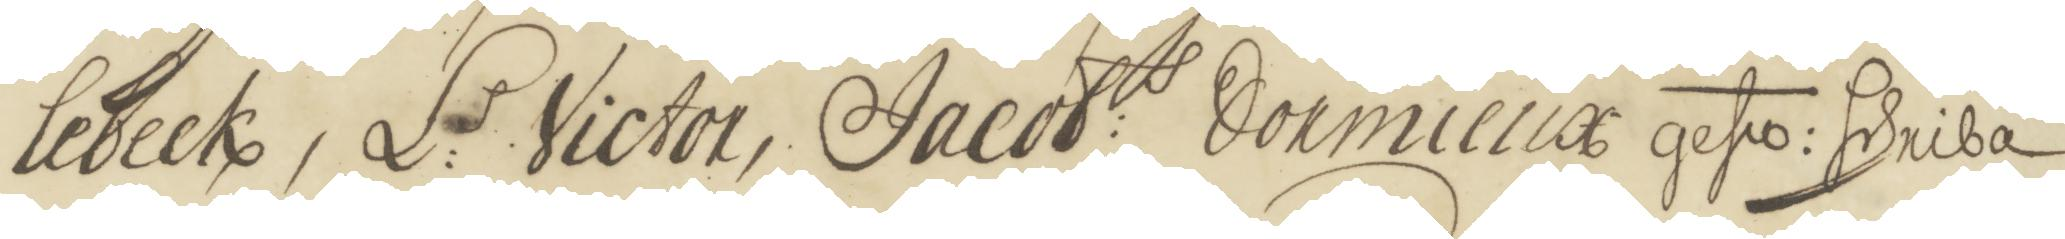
lebeek, L:s Victor, Iacob:s dormieux gesw: Schriba
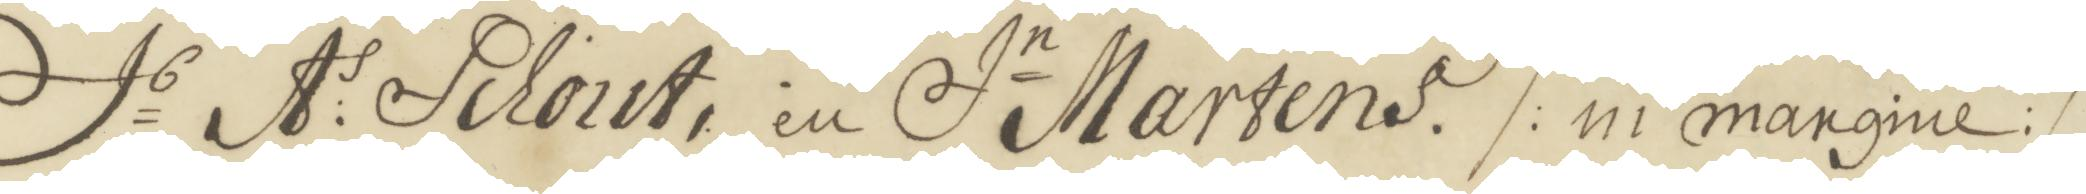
J=s A:s Schout, en I=n Martens. /: in margine:/
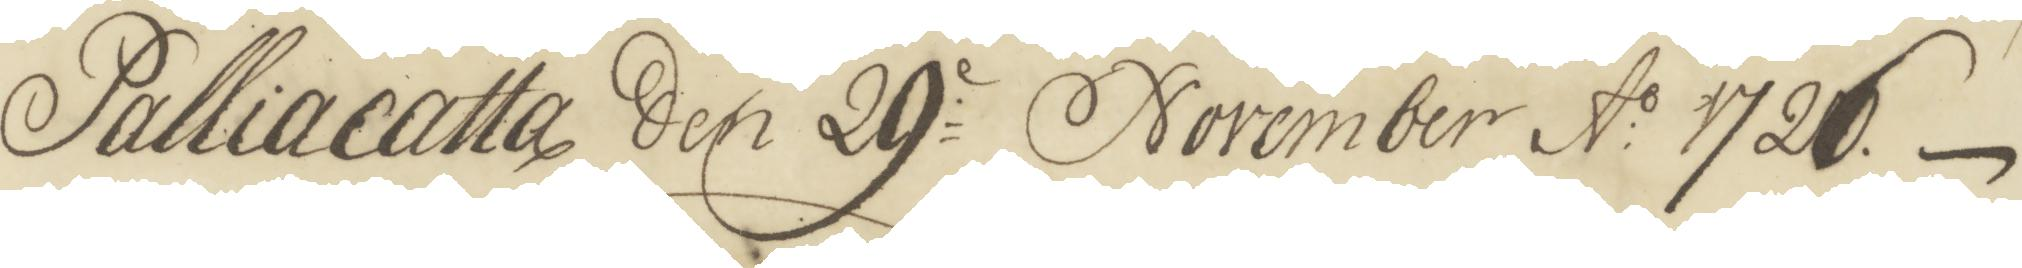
Palliacatta den 29:e November A:o 1726.—
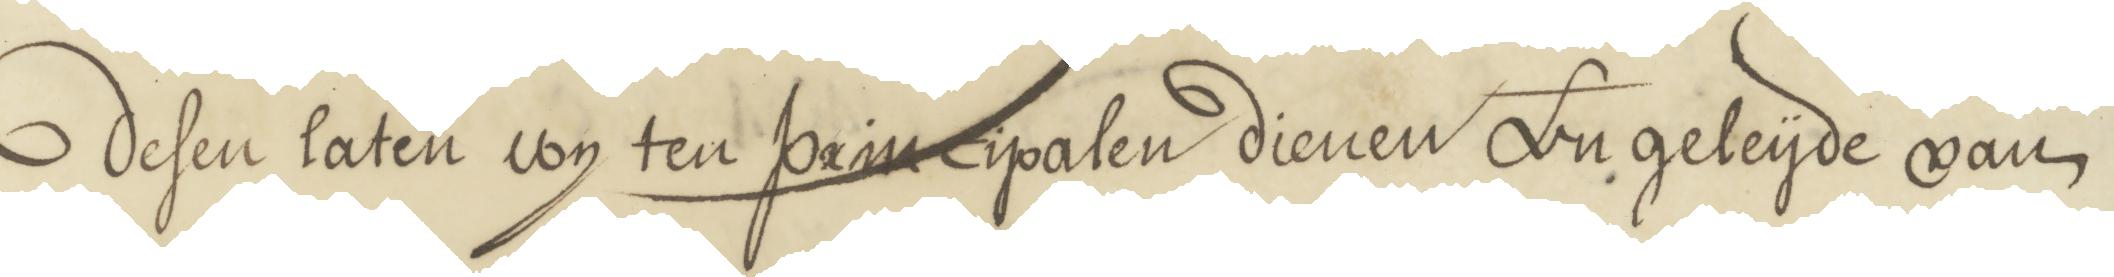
desen laten wy ten principalen dienen ten geleijde van
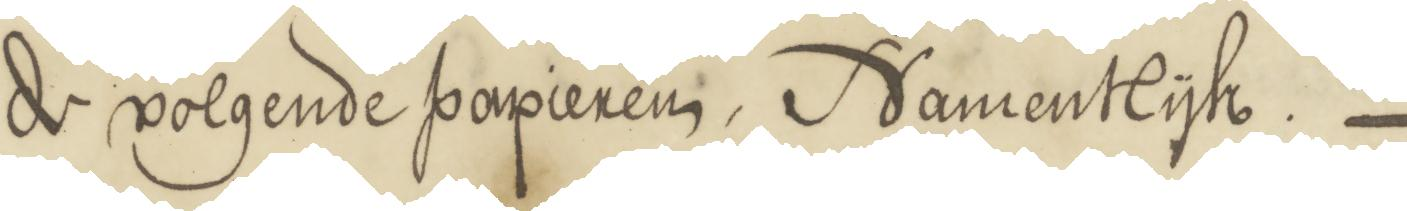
de volgende papieren, Namentlijk. —
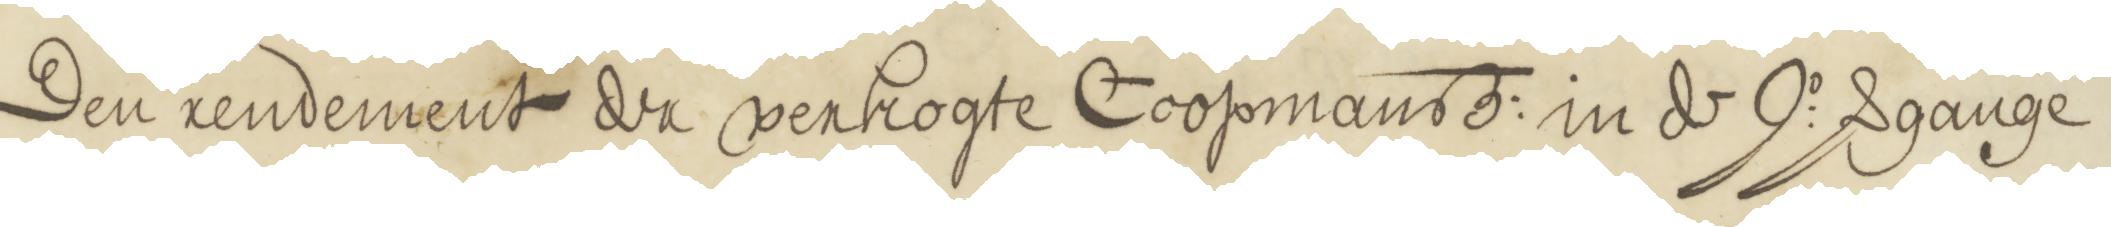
Een rendement der verkogte Coopmansz: in de J:o vergange
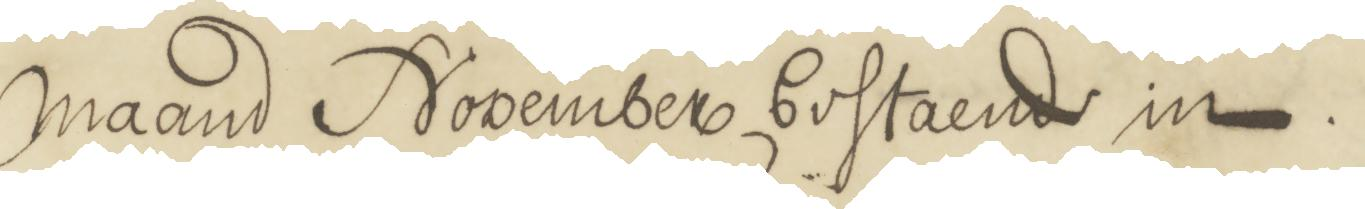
maand November bestaende in.
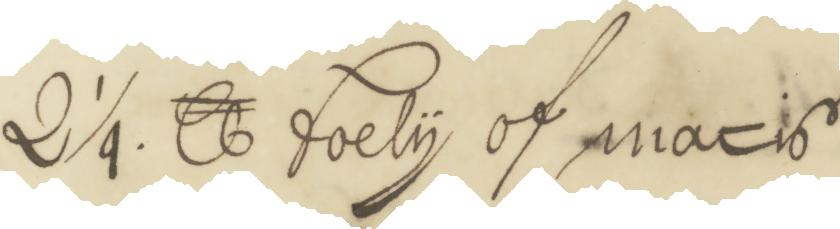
2¼. lb foelij of macis
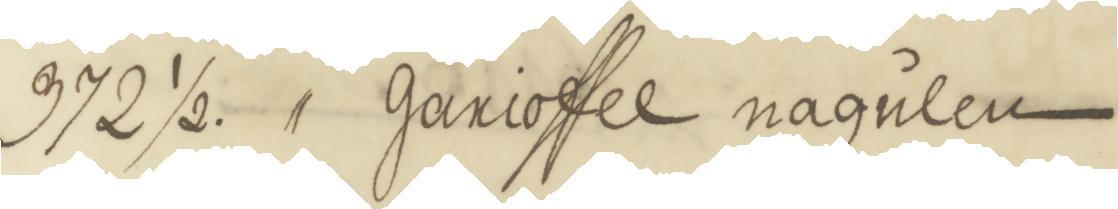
372½. „ Garioffel nagulen
